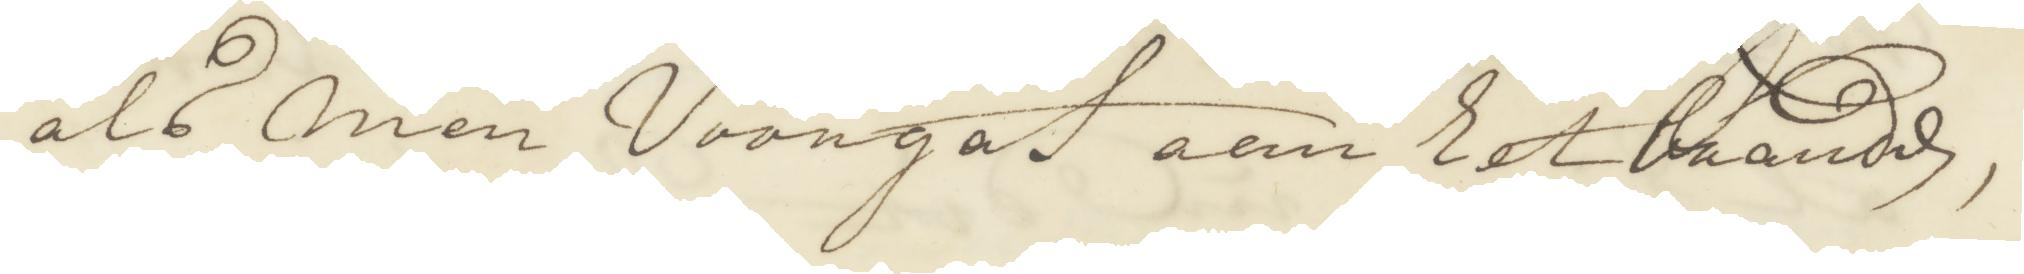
als men voorgaf aan het branden,
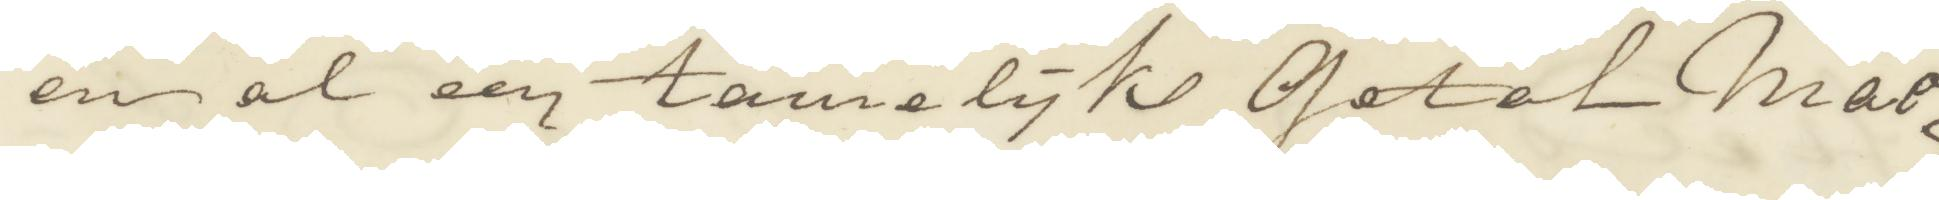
en al een tamelijk getal Mac
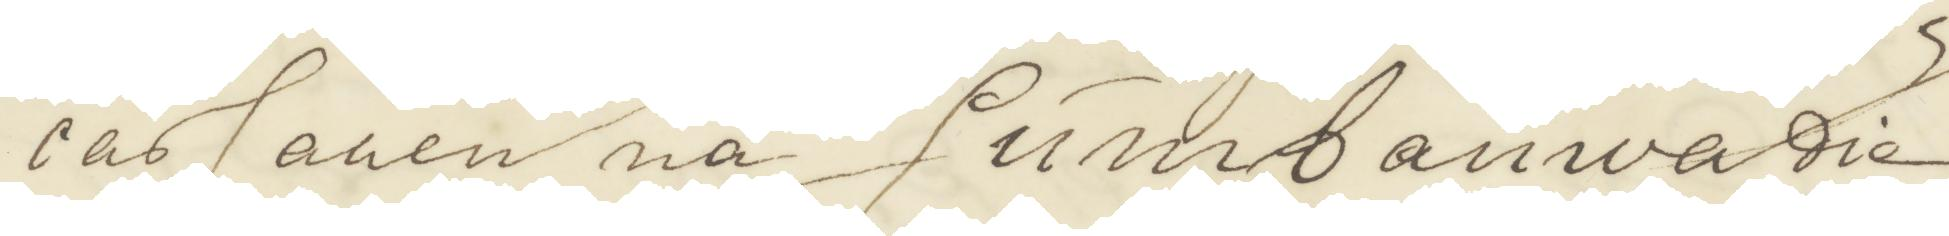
cassaren na Sumbauwa die
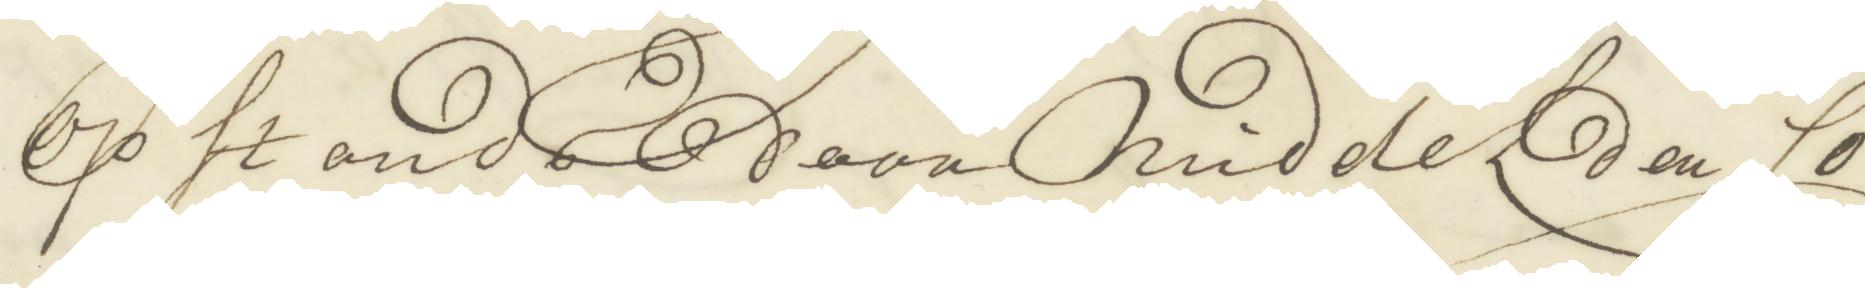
op stands door middel den Co
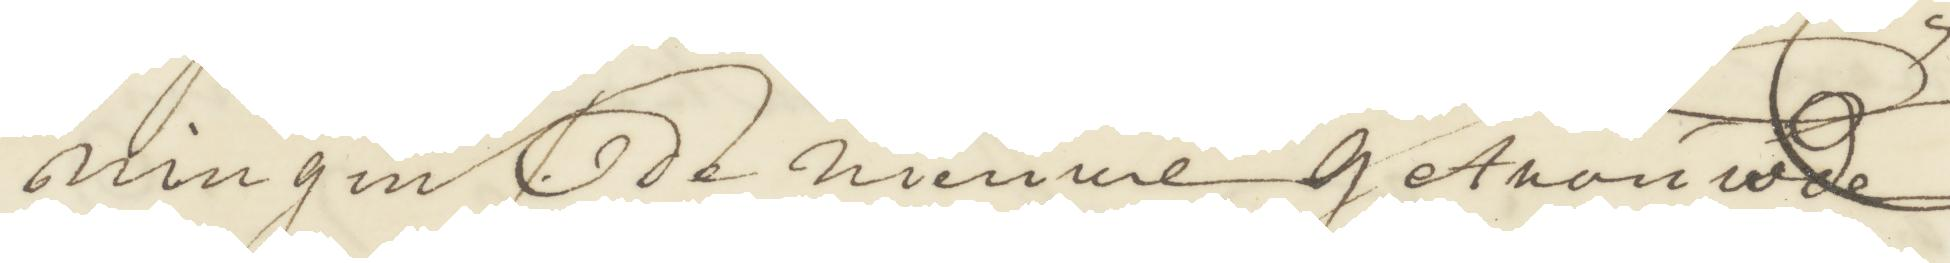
ningin de nieuwe getrouwde
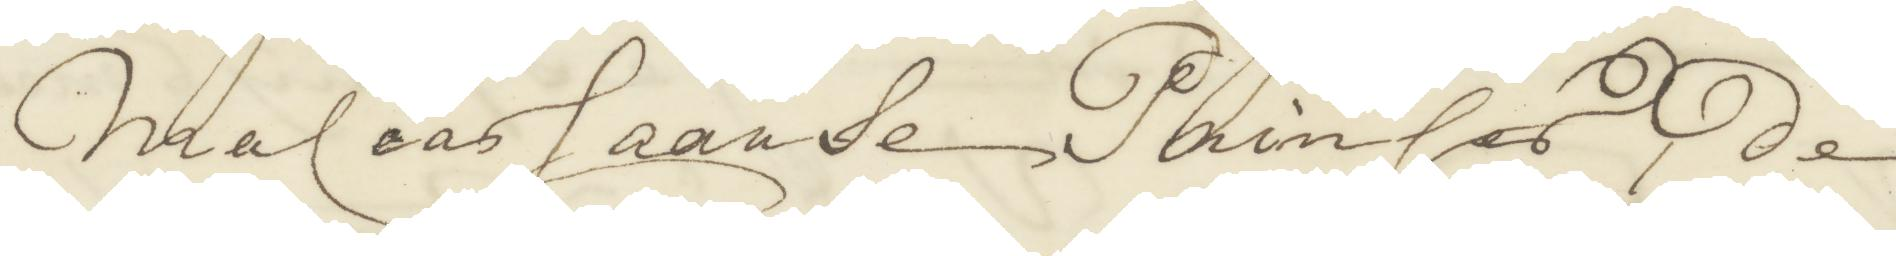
Maccassaarse Princes, de
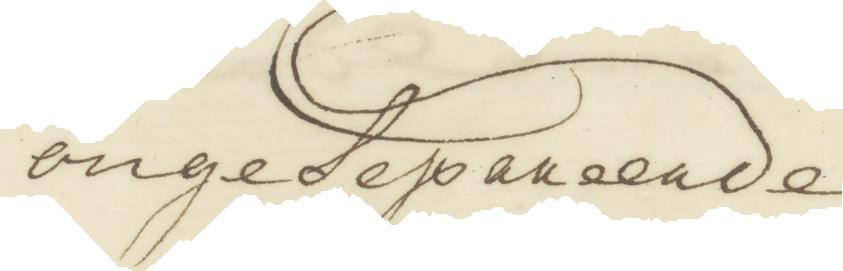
ongesepareerde
